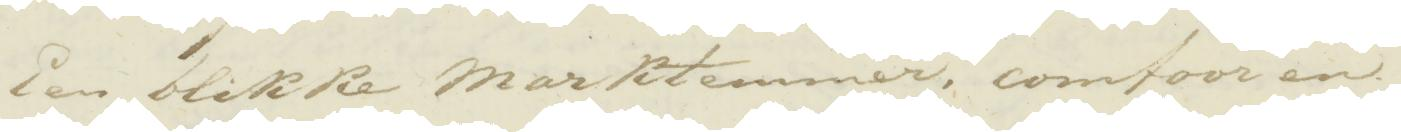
Een blikke marktemmer, comfoor en
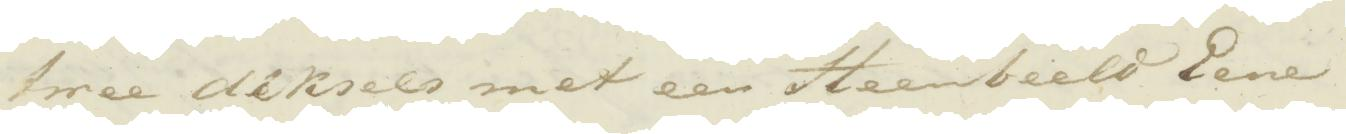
twee deksels met een Heerbeeld Eene
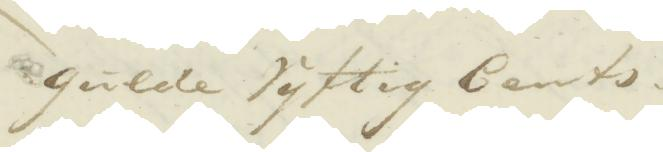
gulde Vyftig Cents
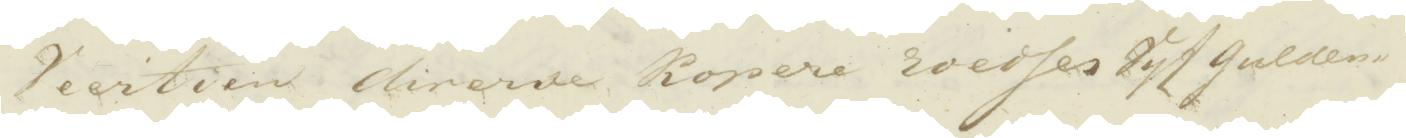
Veertien diverse Kopere roedsen vyf gulden
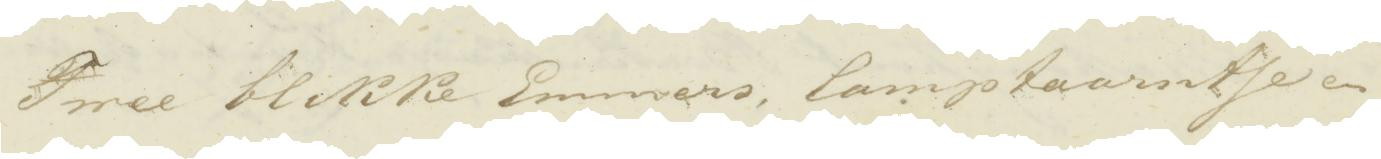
Twee blikke Emmers, lamptaarntje en
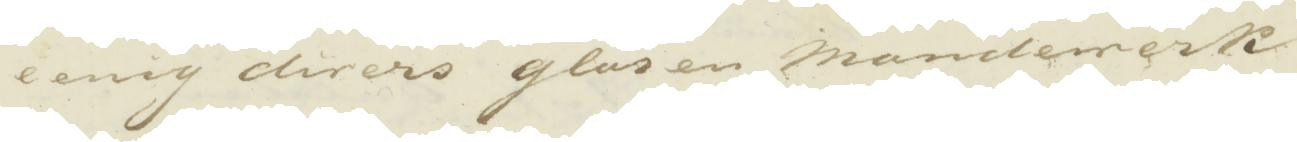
eenig divers glas en mandemerk
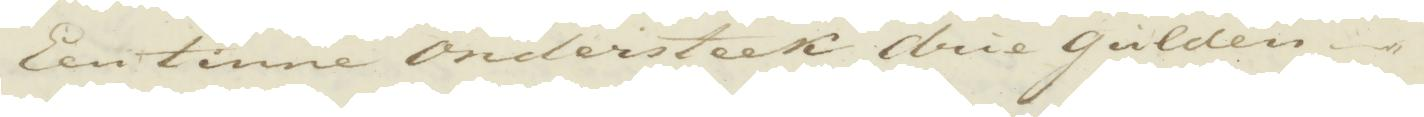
Een tinne ondersteek drie gulden
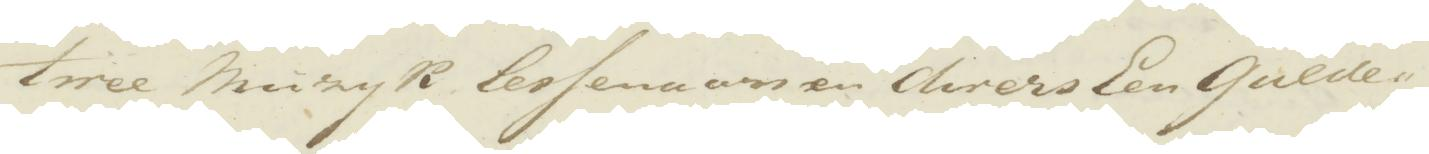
twee Muizyk lessenaars en divers Een gulden
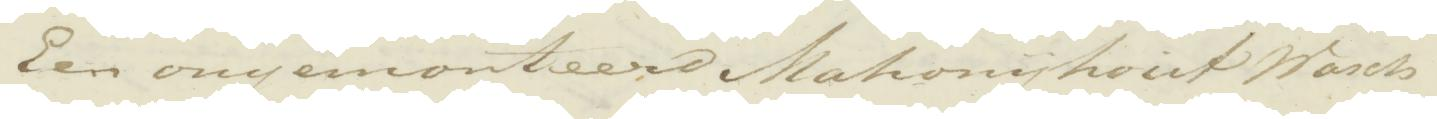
Een ongemonteerd Mahonijhout Wasch
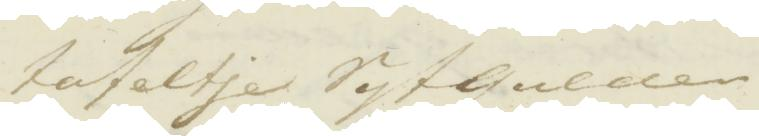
tafeltje Vyf Gulden
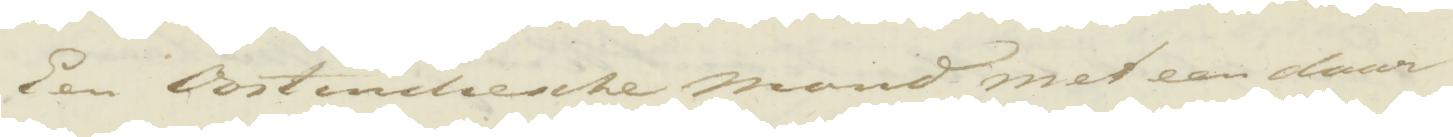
Een Oostindiesche mand met een daar
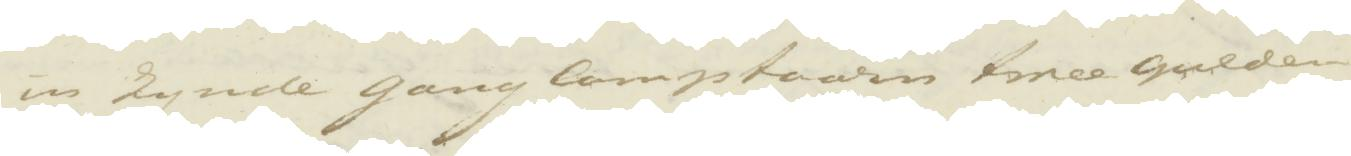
in zynde gang Comphoorn twee Gulden
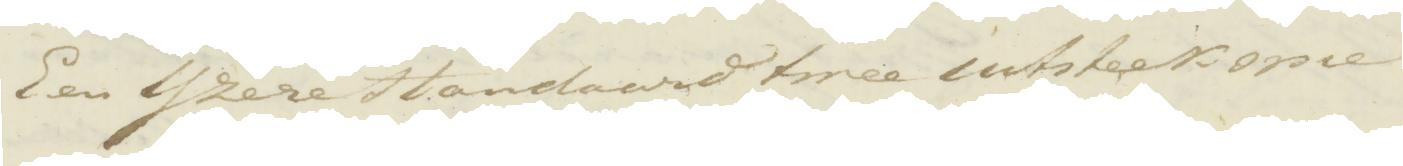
Een Yzere standaard twee uitsteekspie
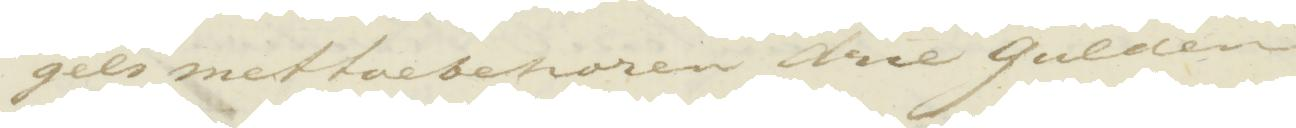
gels met toebehoren drie gulden
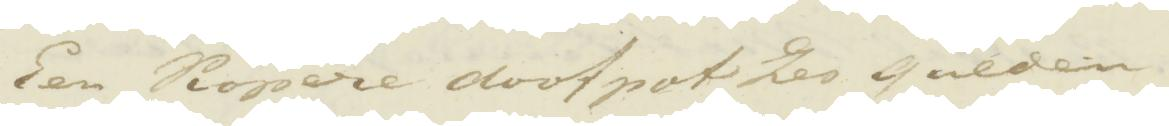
Een Kopere doofpot zes gulden
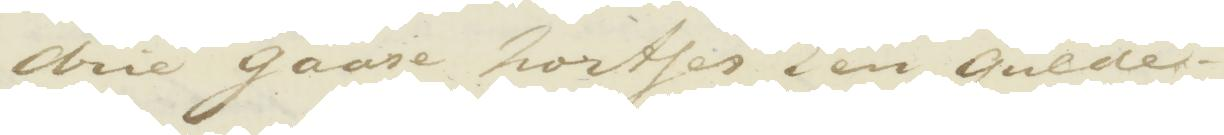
drie gaase kortjes Een gulden
